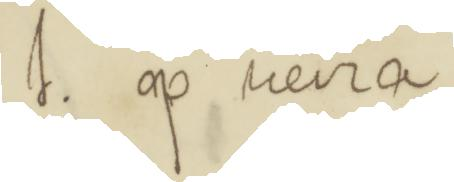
1. op neira
